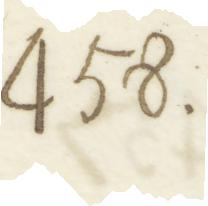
458.
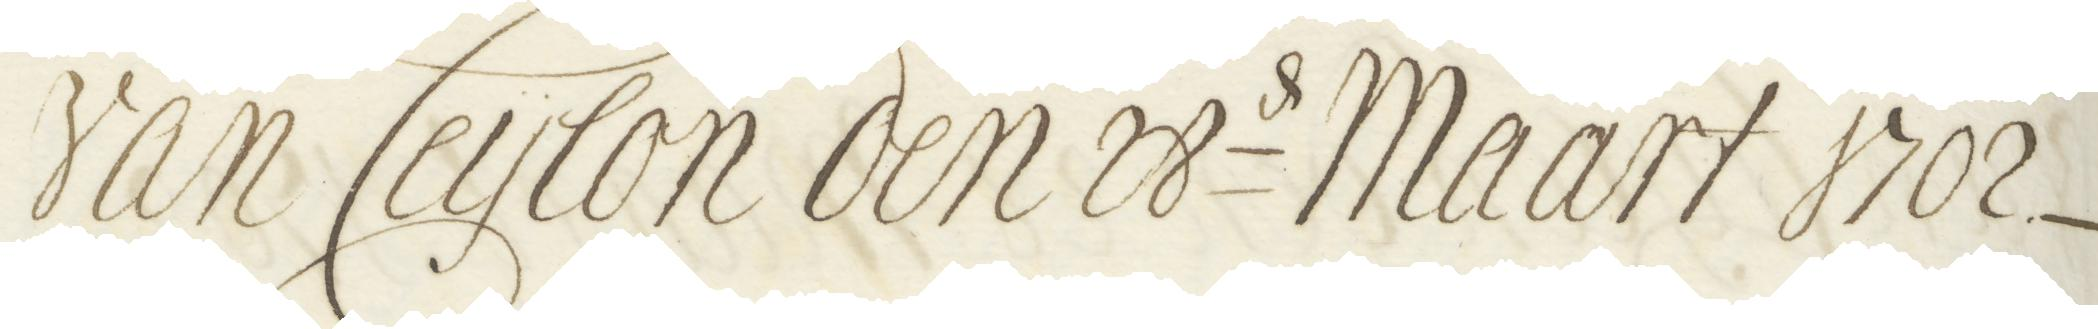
Van Ceijlon den 28=e Maart 1702.—
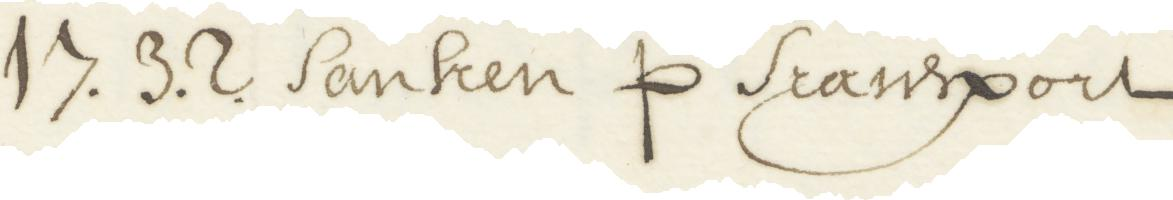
17. 3.2. sanken pr Transport
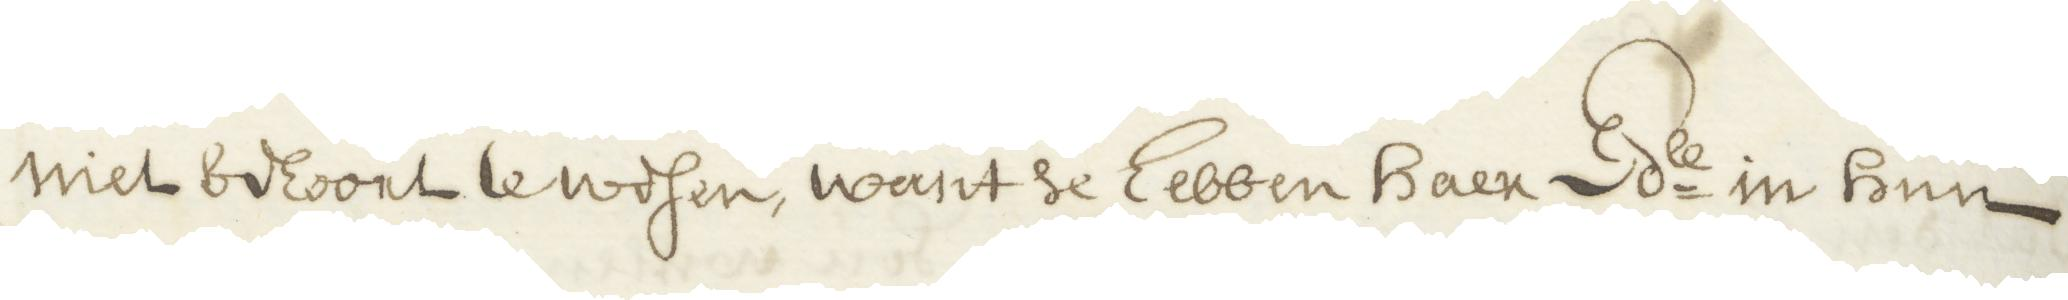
niet behoort tewesen, want se hebben haer Ed=le in hun
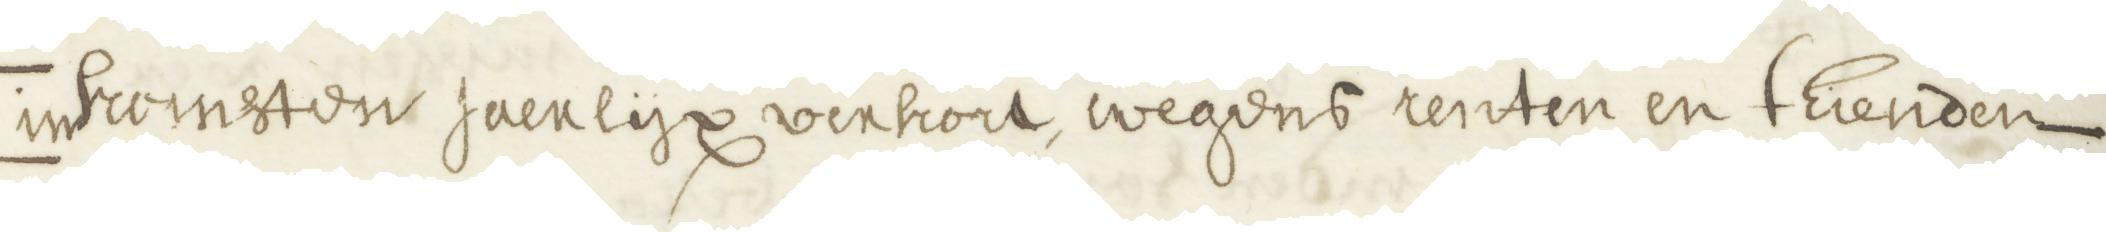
inkomsten jaerlijx verkort, wegens renten en thienden
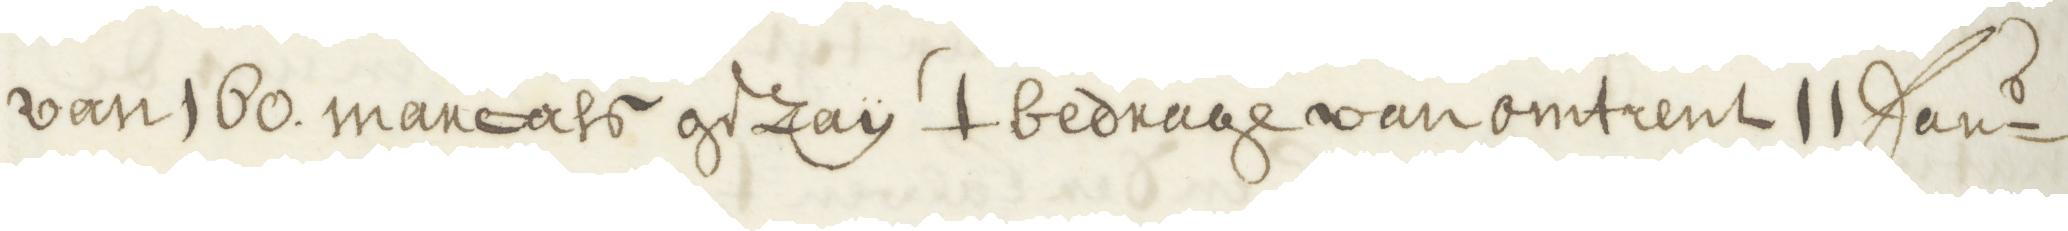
van 160. marcals gezaij ’t bedrage van omtrent 11 Fan=s
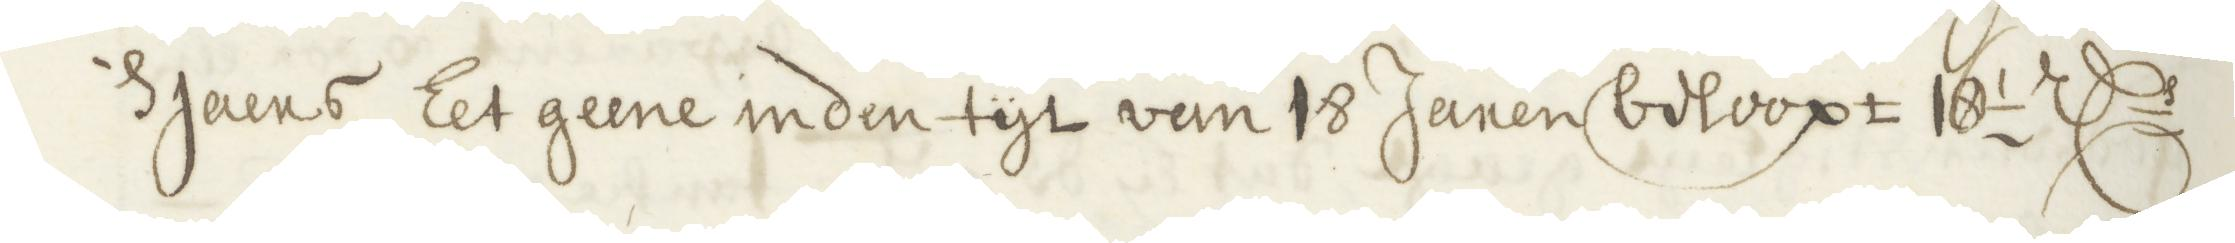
'sjaers, het geene in den tijt van 18 Jaren beloopt 16½ rx=s
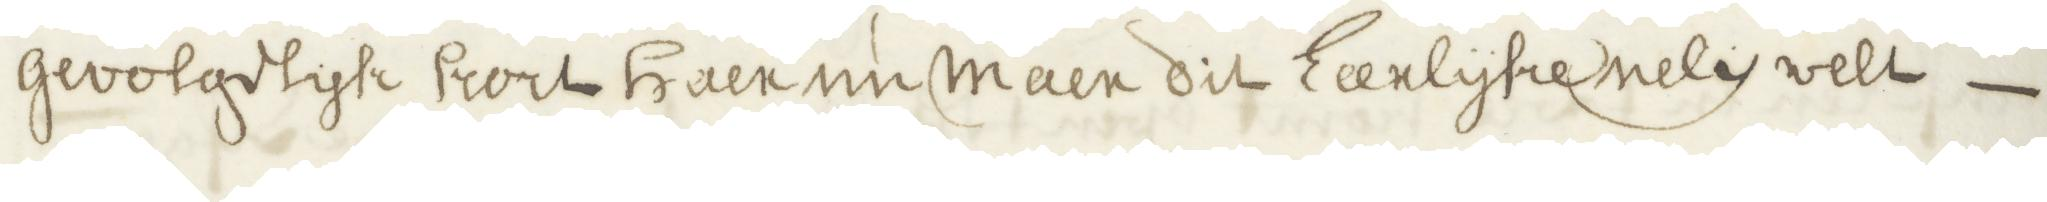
gevolgelijk kort haer nu maer dit heerlijke nelij velt —
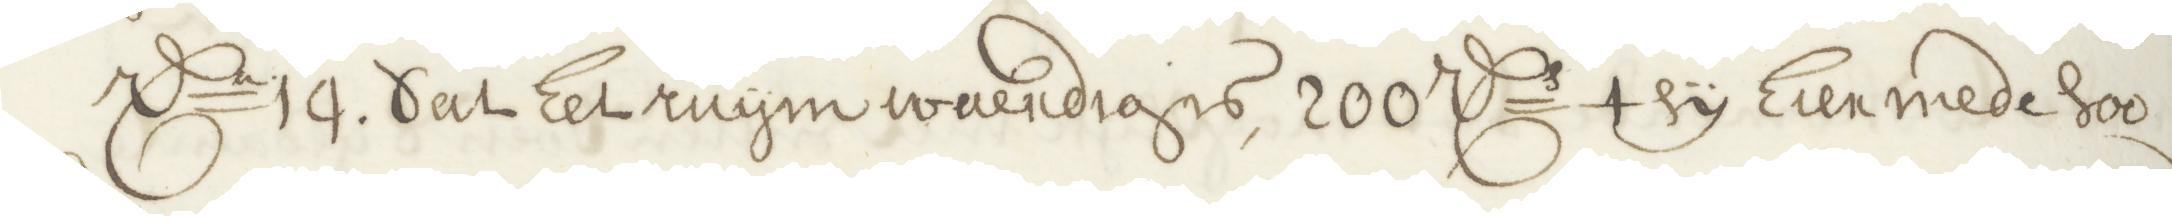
rx=s 14. dat het ruijm waerdig is, 200 rx=s t sij hier mede soo
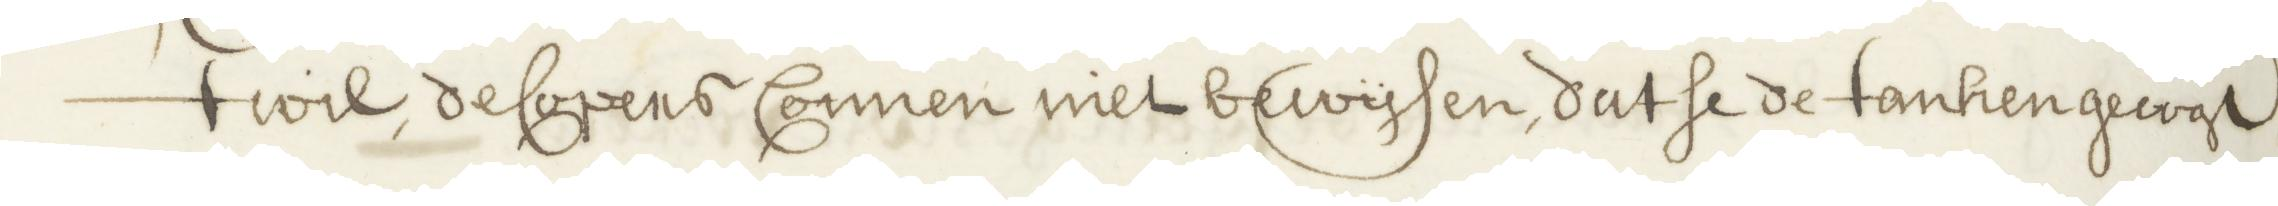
'twil, de Copers Connen niet bewijsen, dat se de tanken gecogt
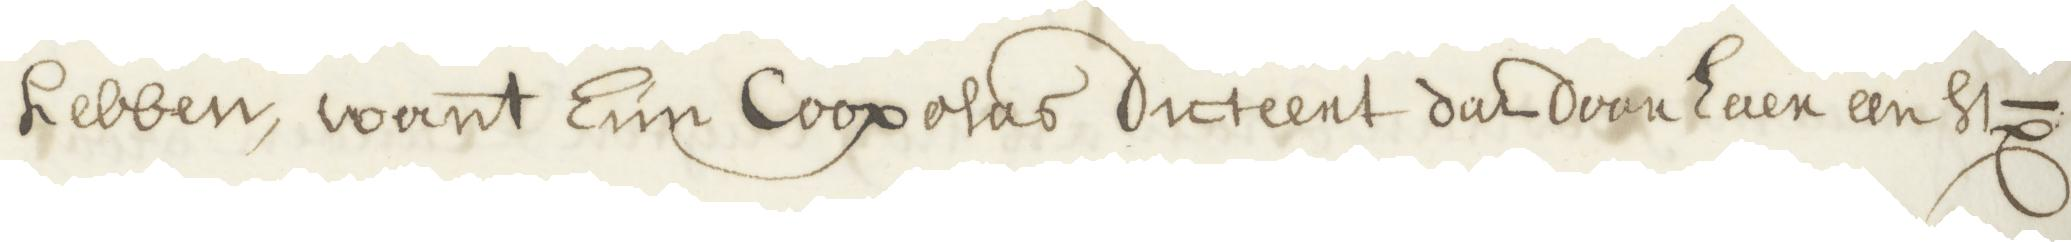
hebben, want hun Coopolas dicteert dat door haer een st-x
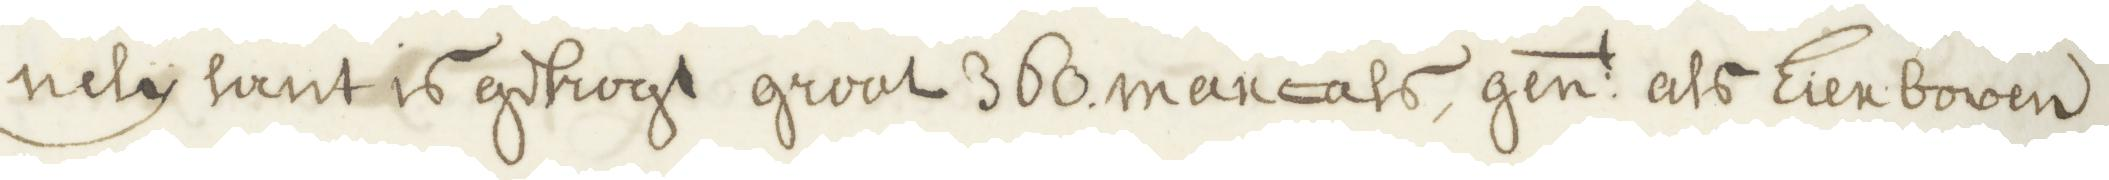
nelij sant is gekogt groot 360. marcals, gen:t als hier boven
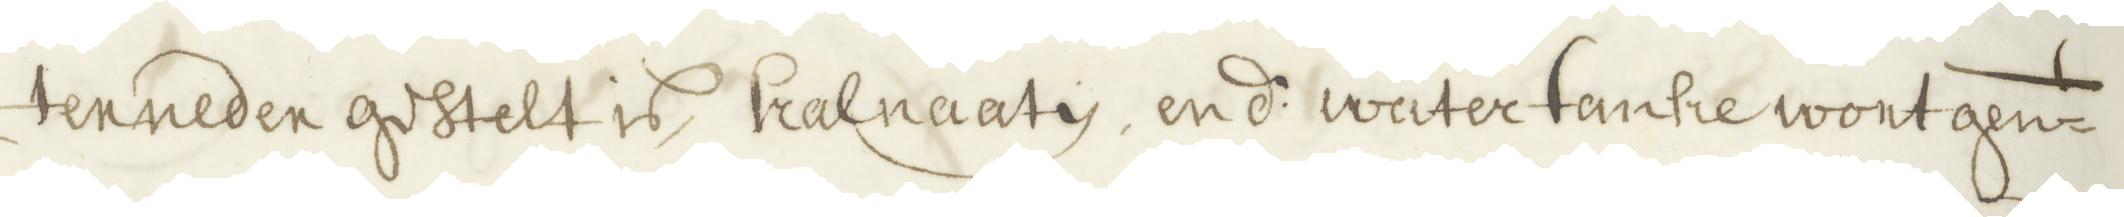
ter neder gestelt is, kalnaatij, en d:o water tanke wort gen=t
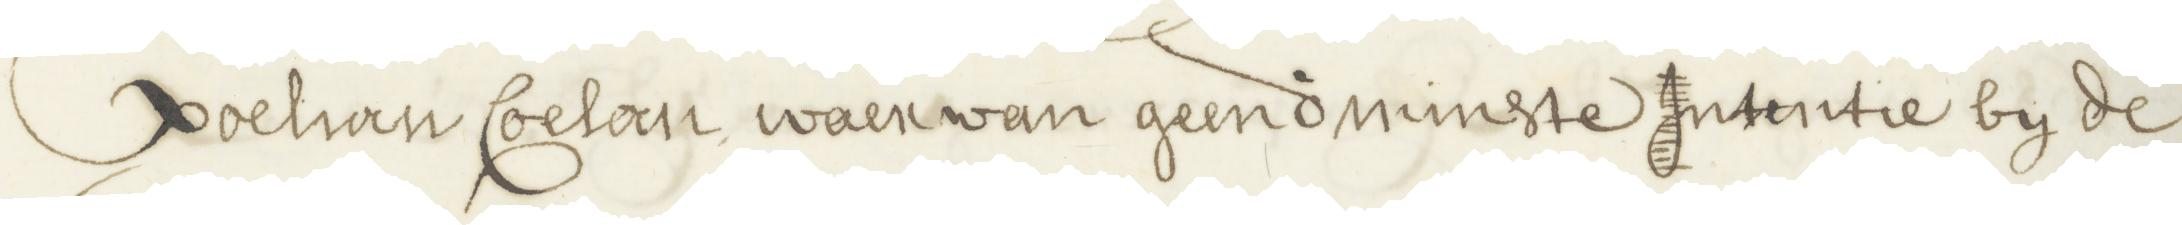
Poelian Coelan, waervan geen d'minste Jntentie bij de
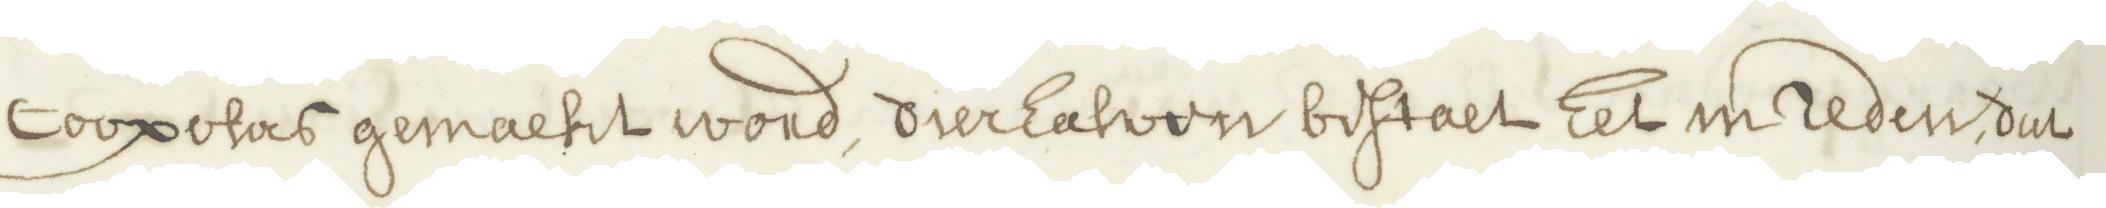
Coopolas gemaekt word, dierhalven bestaet het in reden, dat
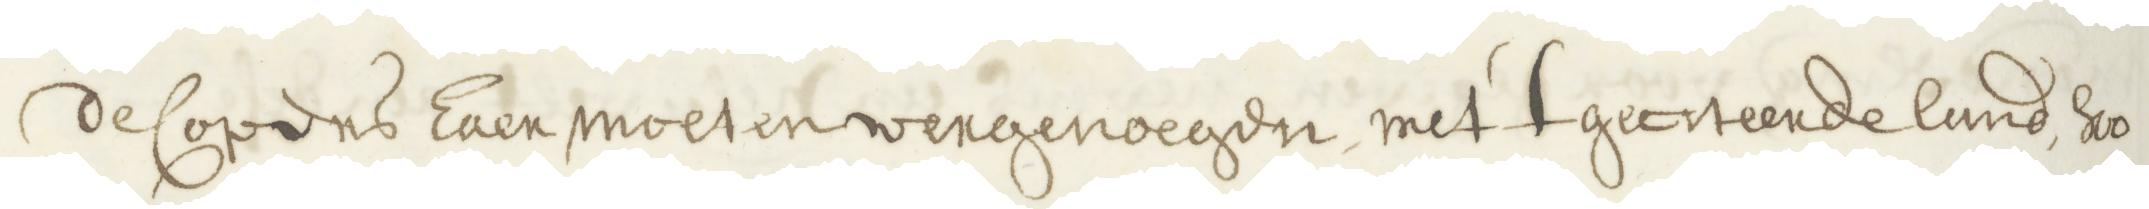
deCopers haer moeten vergenoegen met ’t geciteerde land, soo
